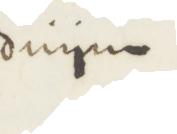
duijm
